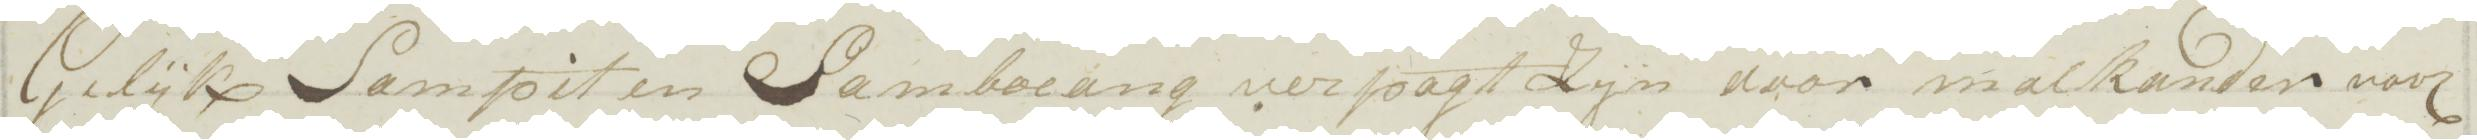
Gelijk Sampit en Pamboeang verpagt zijn door malkander voor
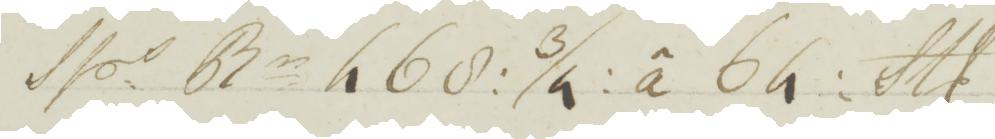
sp=s R=n 468: ¾: â 64: stC
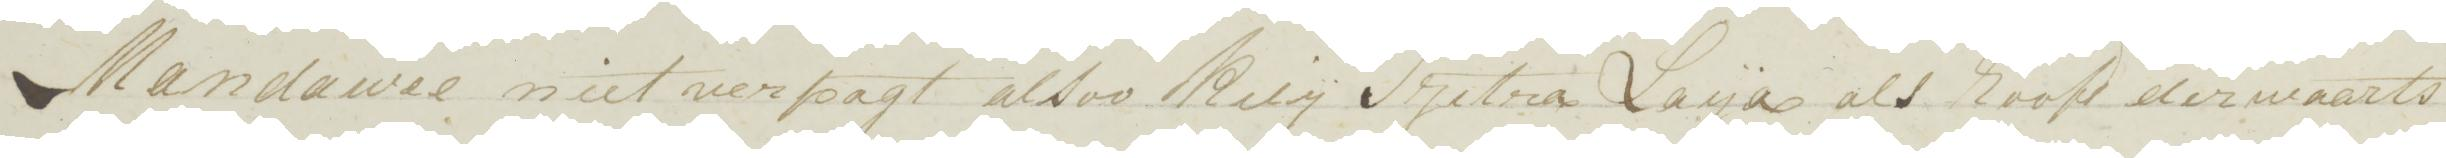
Mandawee niet verpagt alsoo Kirij Tjitra Laija als hooft derwaarts
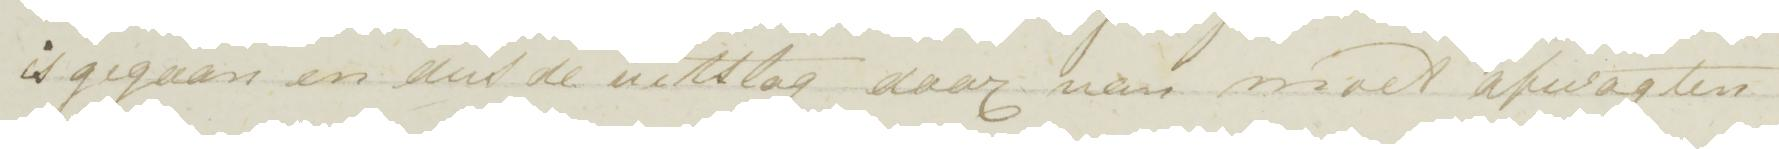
is gegaan en dus de uitslag daar van moet afwagten
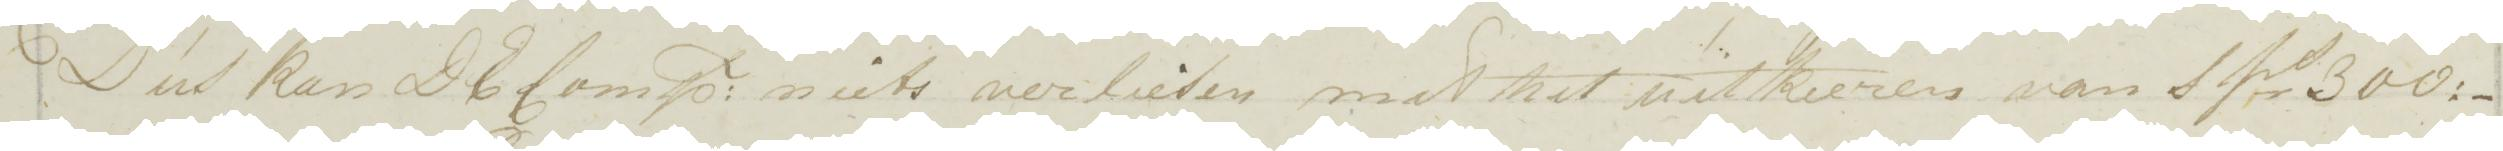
Dus kan D E Comp: niets verliesen met het uitkeeren van sp=s 300: –
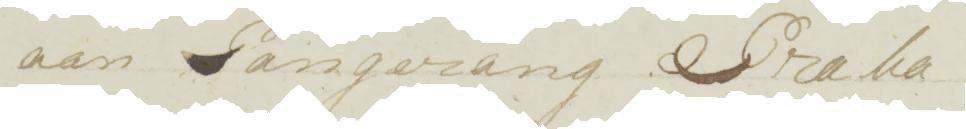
aan Pangerang Praba
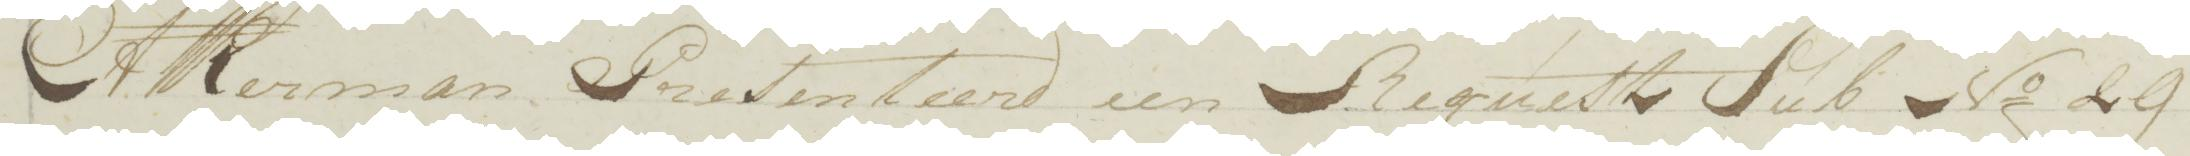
A Kerman Presenteerd een Request Sub N=o 29
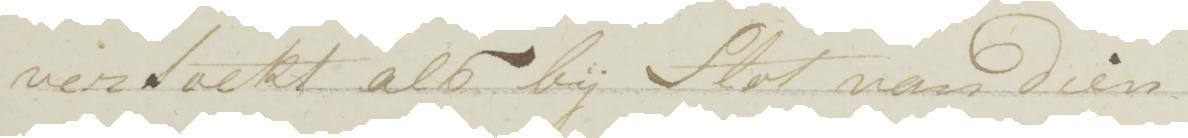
versoekt als bij stot van dien
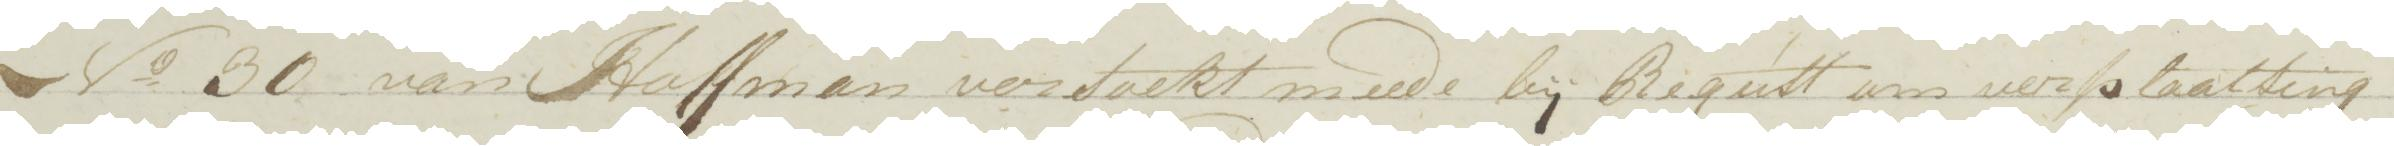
N=o 30 van Hoffman versoekt meede bij Requst om verplaatsing
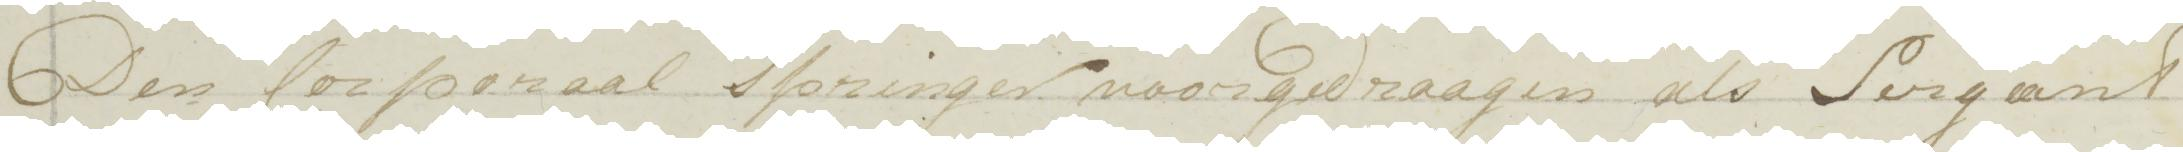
Den Corporaal springer voorgedraagen als sergeant
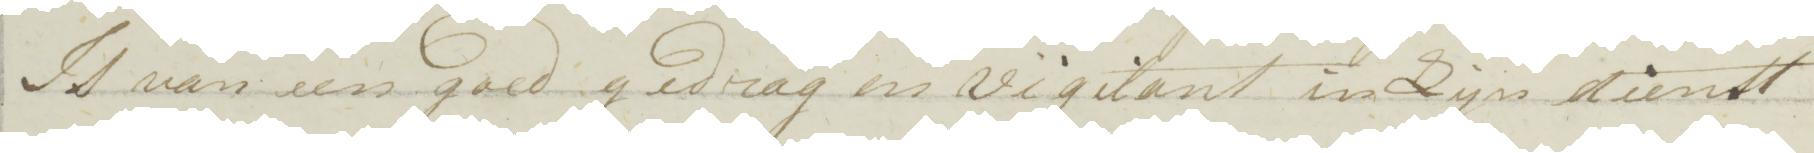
Is van een goed gedrag en vigilant in zijn dienst
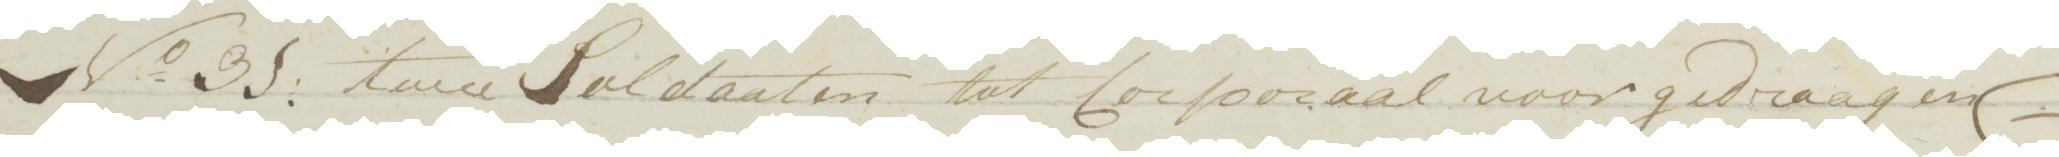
N=o 31: twee Soldaaten tot Corporaal voorgedraagen
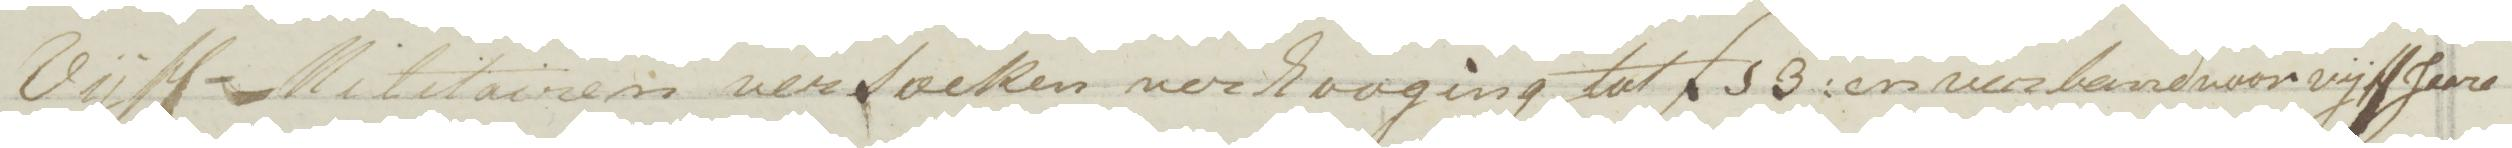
Vijff Militairen versoeken verhooging tot ƒ53: en verband voor vijff Jaare
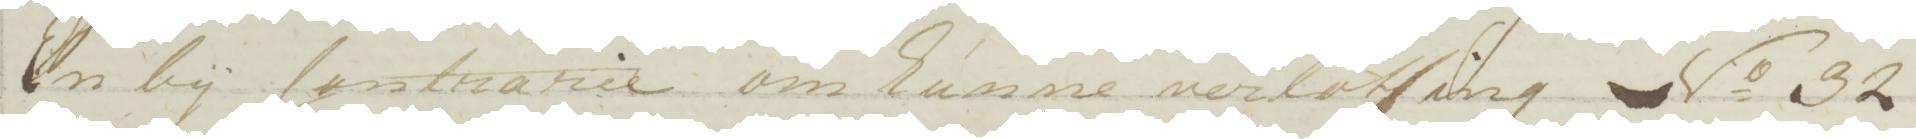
En bij Contrarie om hunne verlossing N=o 32
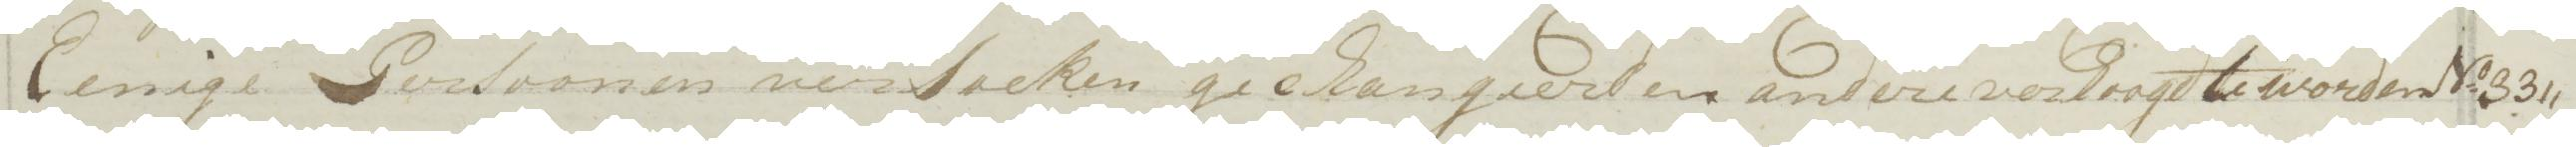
Eenige Persoonen versoeken gechangeerd en andere verhoogd te worden N=o 33„
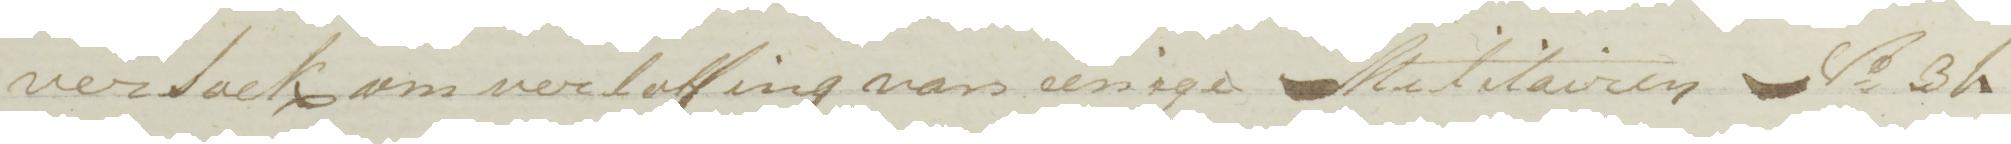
versoek om verlossing van eenige Mititairen N=o 34
